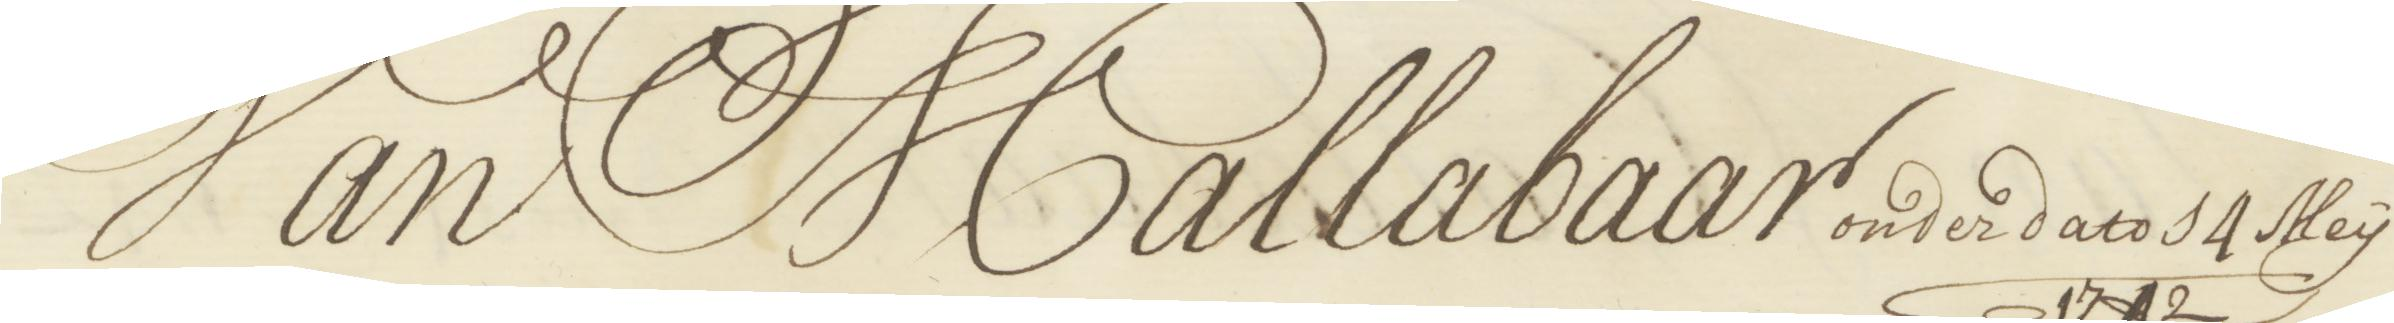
Van Mallabaar onder dato14 Meij
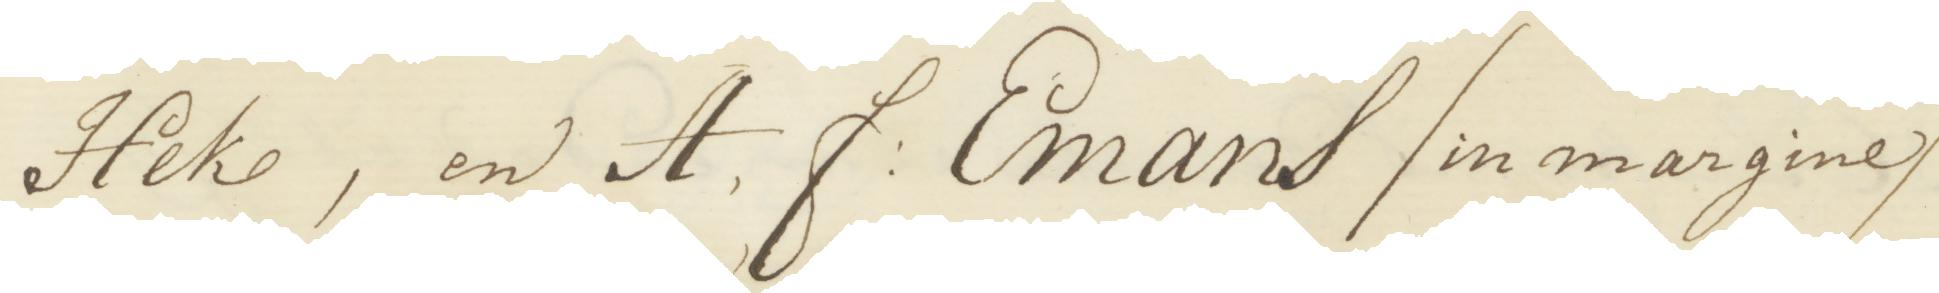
Hek, en A. f: Emans /in margine/
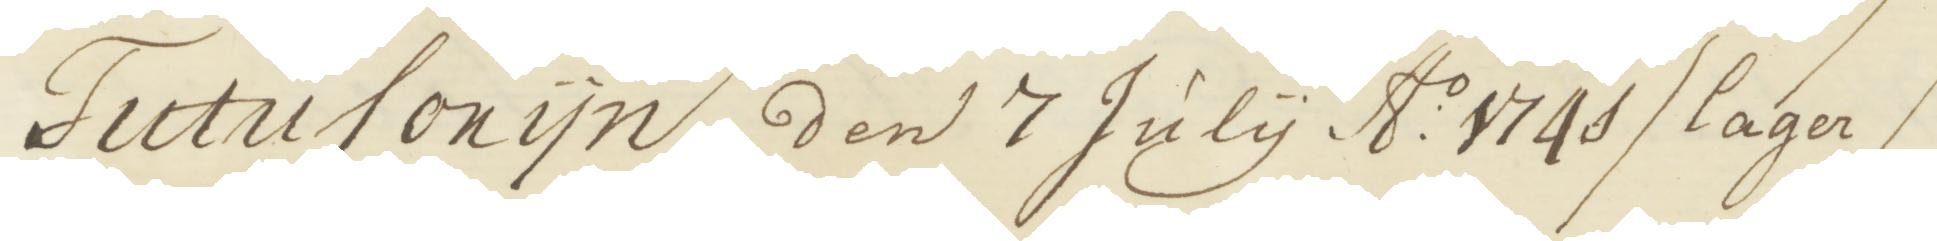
Tutucorijn, den 7 Julij A:o 1741 /lager/
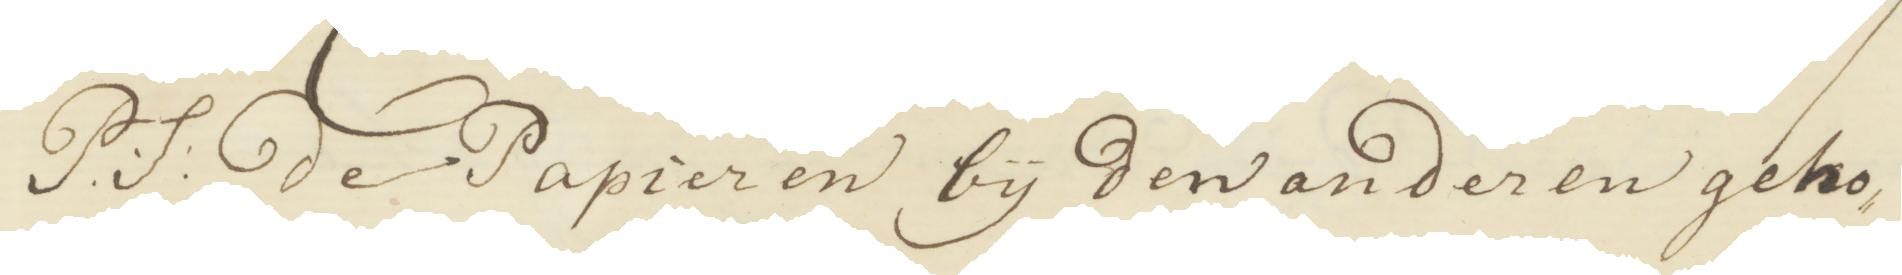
P: S: de Papieren bij den anderen geko„
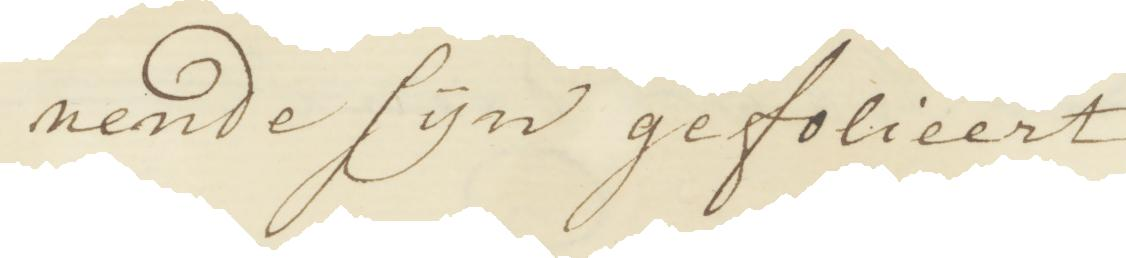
nende sijn gefolieert
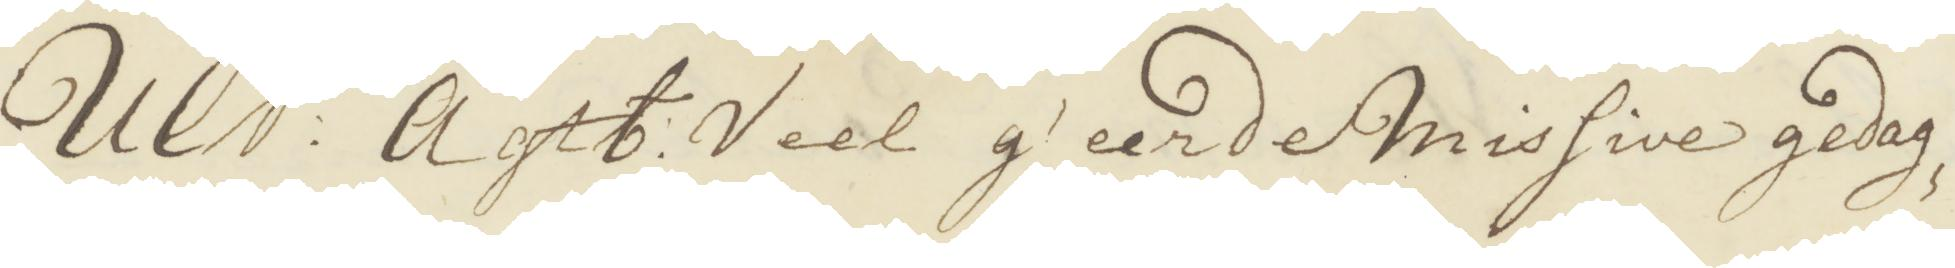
UEd: Agtb: veel g’eerde missive gedag„
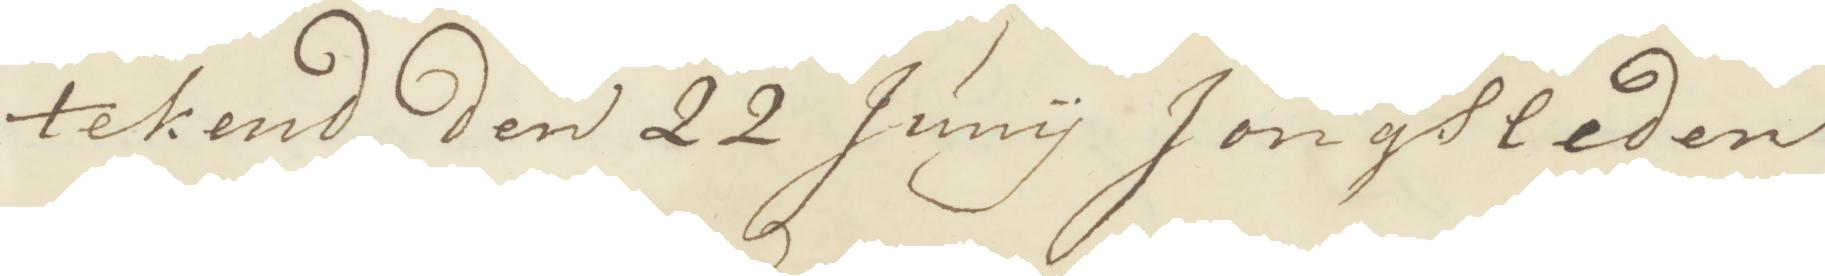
tekend den 22 Junij Jongsleden
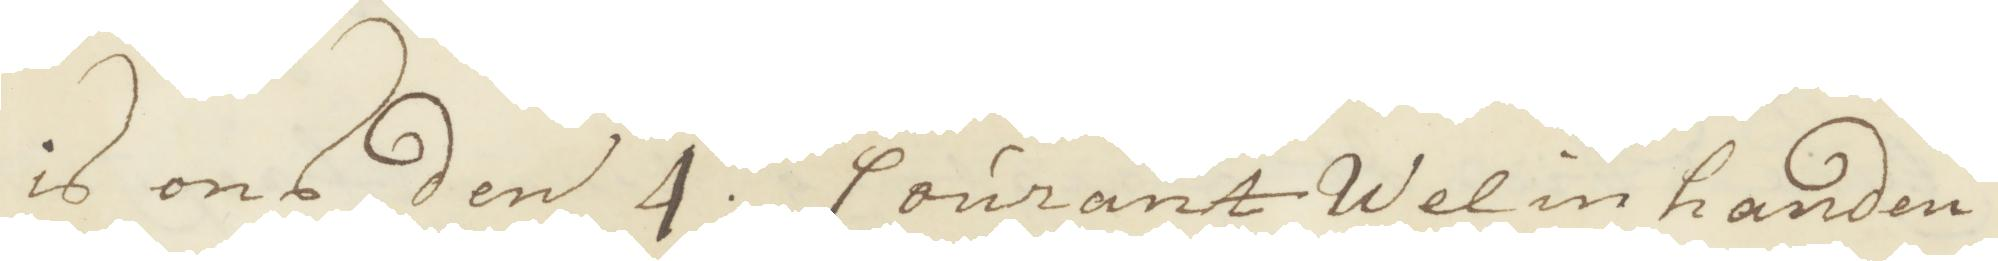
is ons den 4.' Courant wel in handen
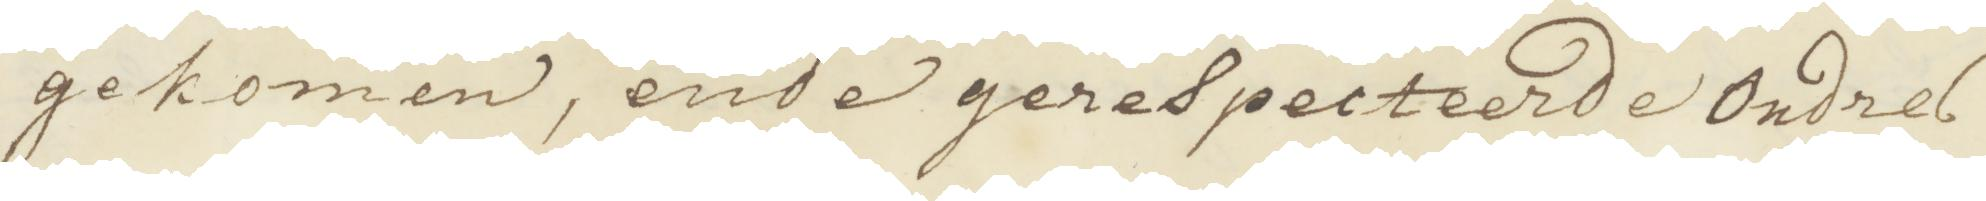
gekomen, ende gerespecteerde ordre
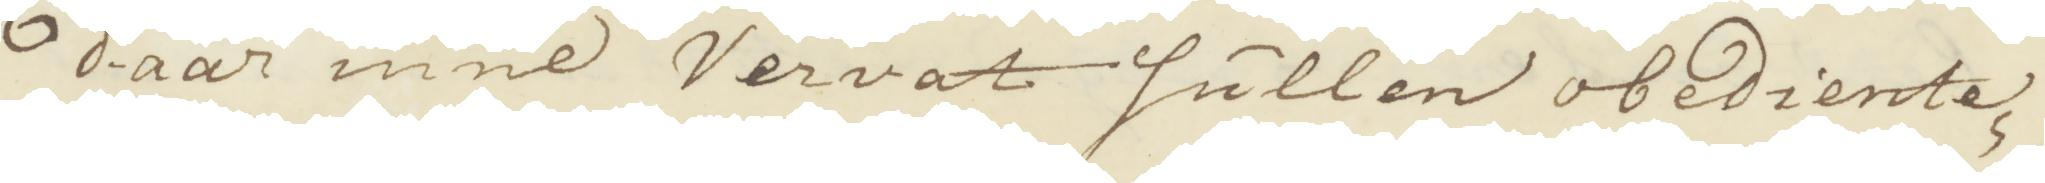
daar inne vervat sullen obediente„
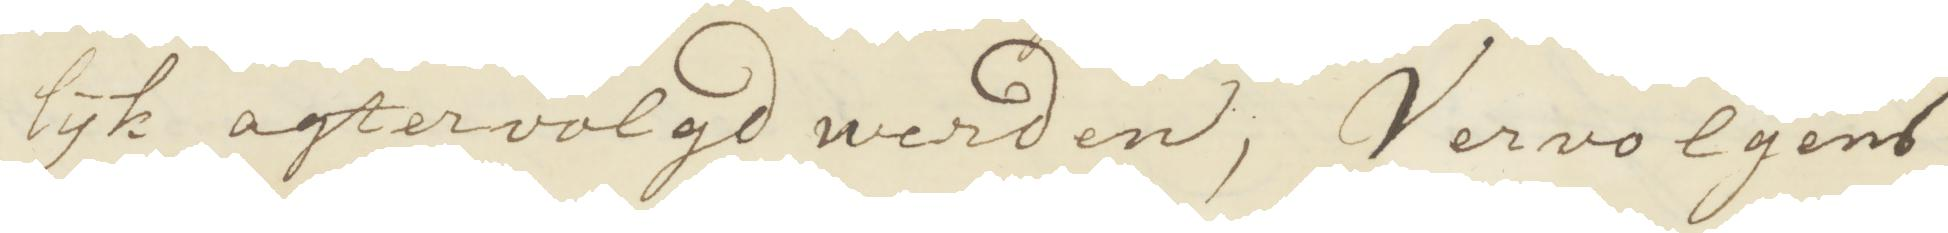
lijk agtervolgd werden; Vervolgens
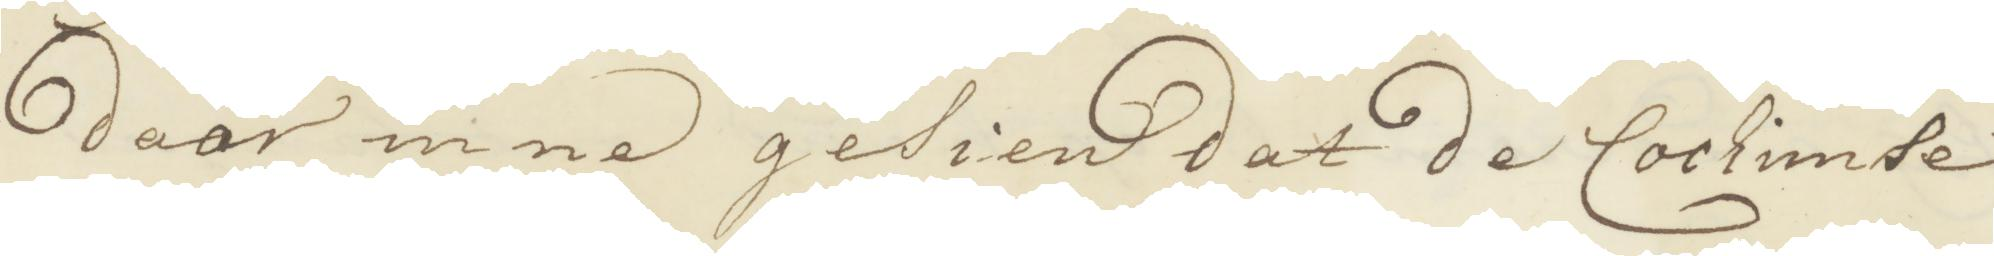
daar inne gesien dat de Cochimse
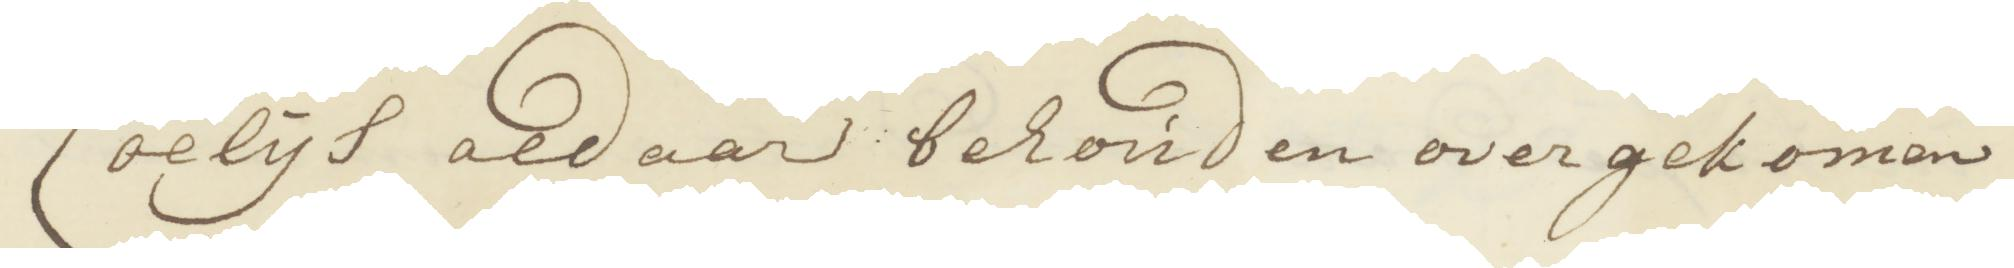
Coelijs aldaar behouden overgekomen
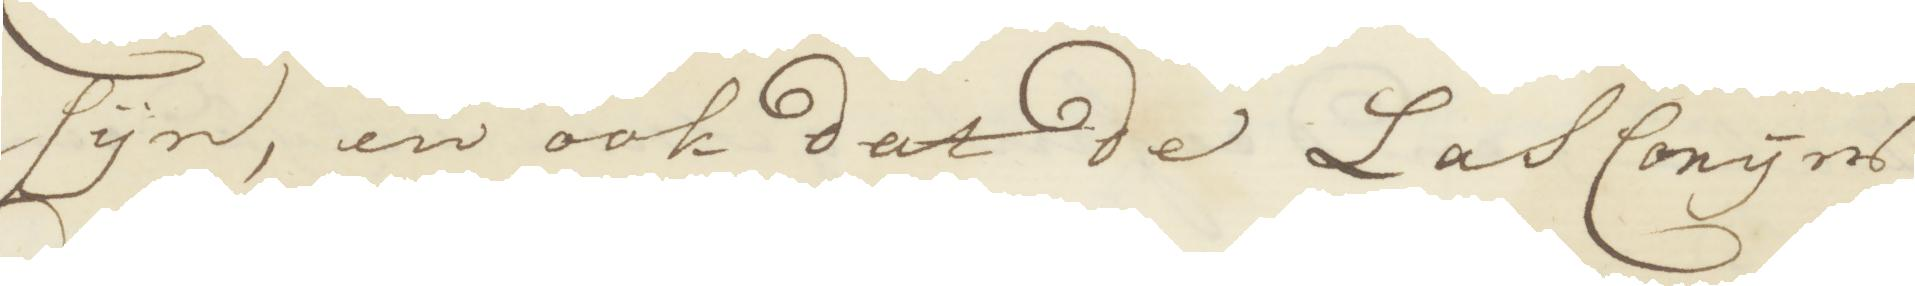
sijn, en ook dat de Las Corijns
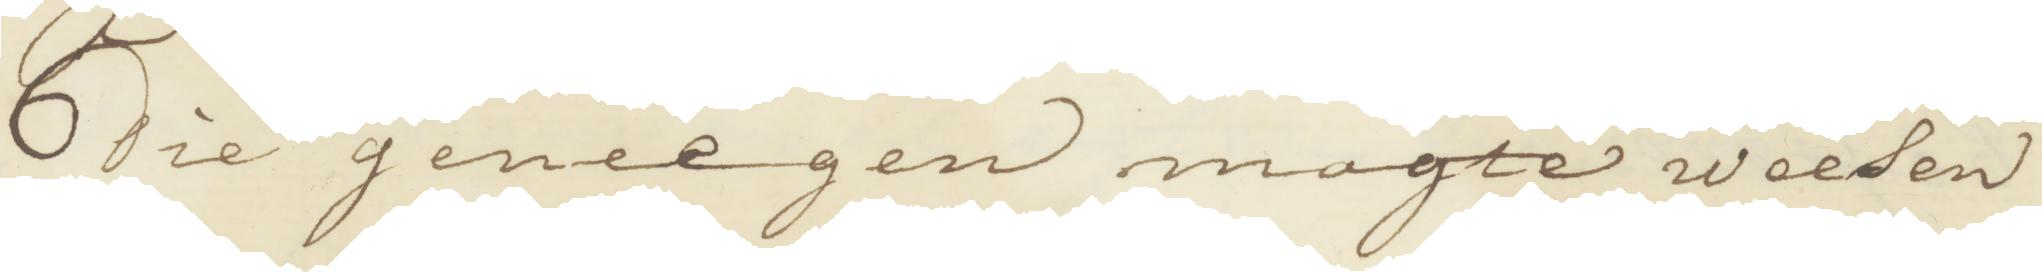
die geneegen mogte weesen
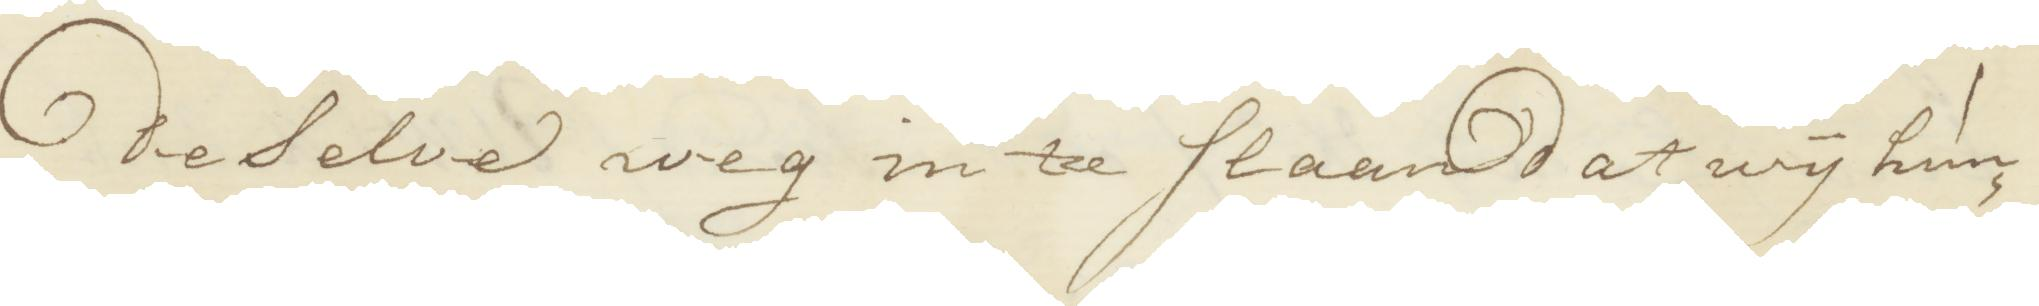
deselve weg in te slaan dat wij hun„
